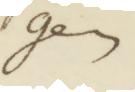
gen .—
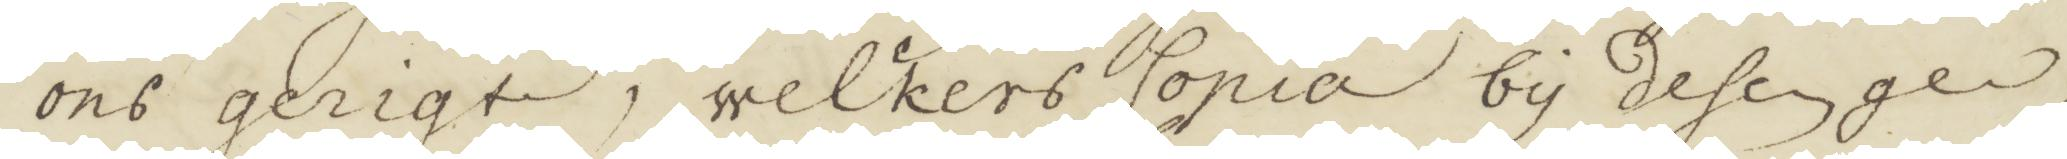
ons gerigt, welkers Copia bij desen gev
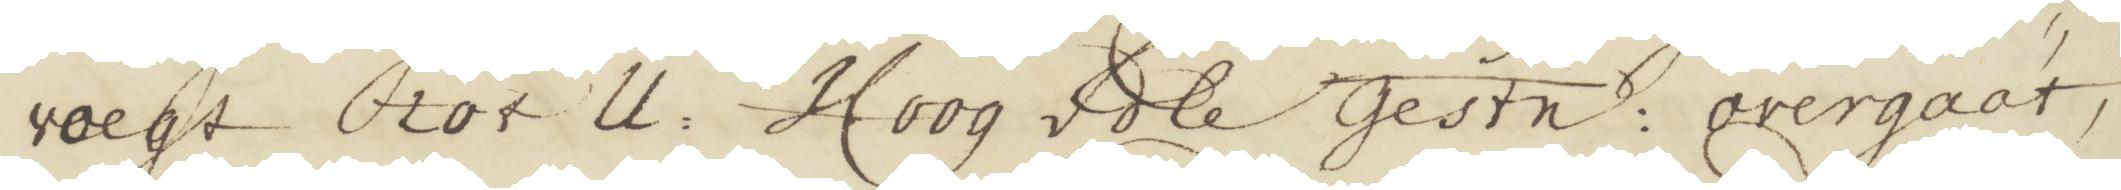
voegt tot U: Hoog Edle gestr: overgaat,
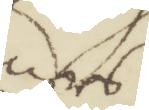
ers
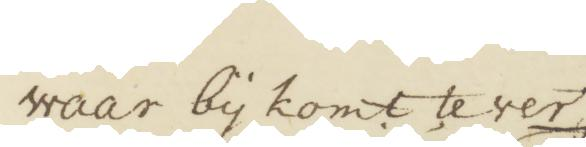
waar bij komt te ver„
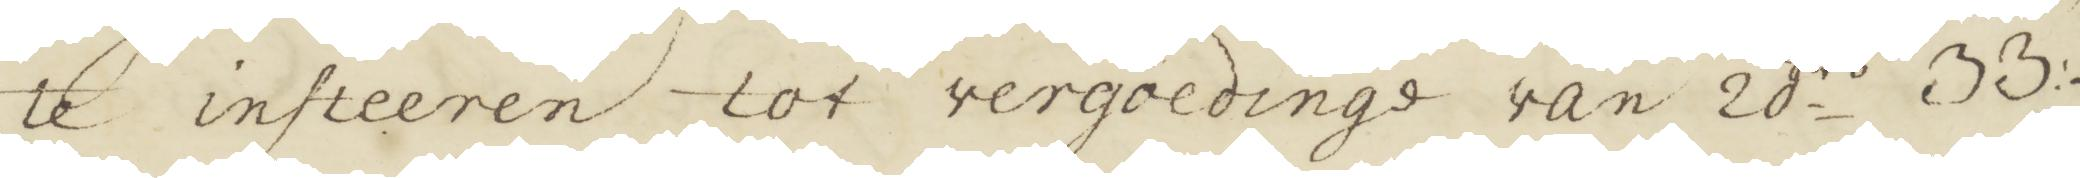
te insteeren tot vergoedinge van rd=s 33:-:
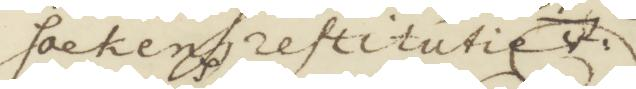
soeken restitutie van
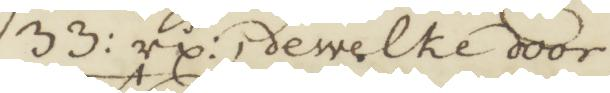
33: rx:s, dewelke door
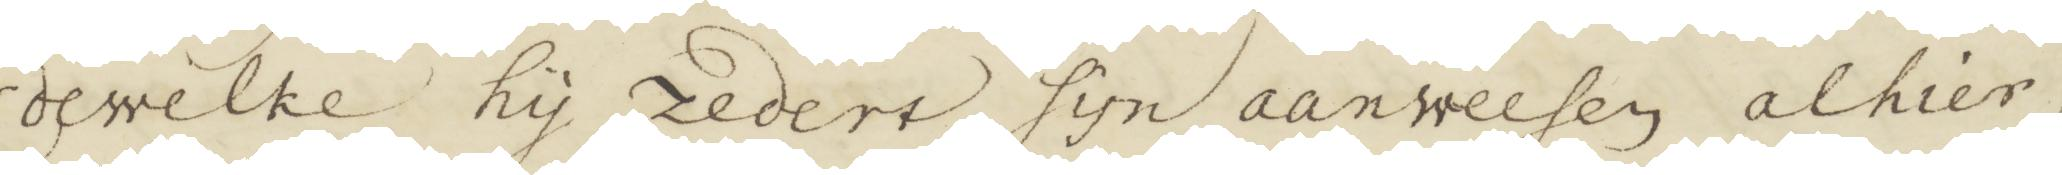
dewelke hij zedert sijn aanweesen alhier,
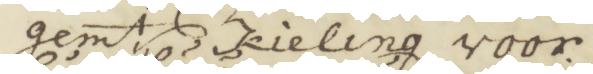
gem„t Kieling voor
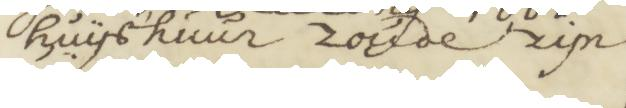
huijshuur zoude zijn
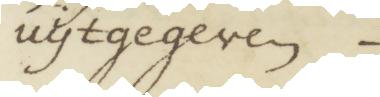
uijtgegeven — —
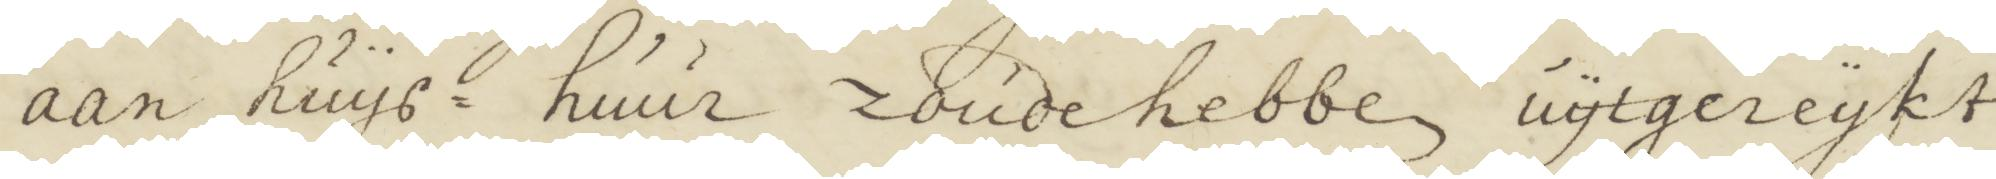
aan huijs=huur zoude hebben uijtgereijkt,
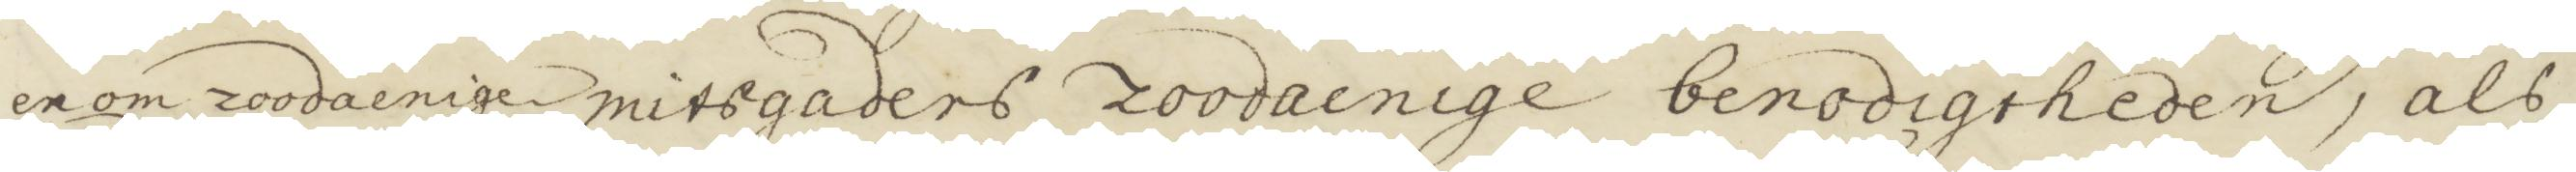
er om zoodaenigen mitsgaders zoodaenige benodigtheden, als
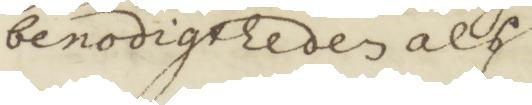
benodigtheden als . - -
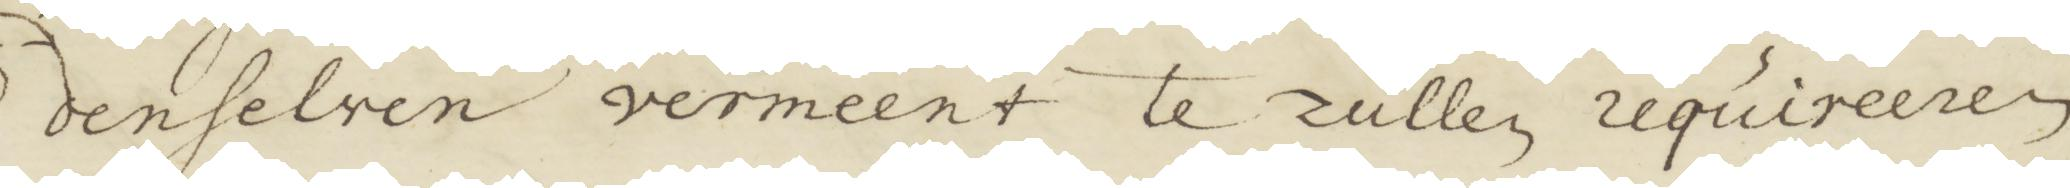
denselven vermeent te zullen requireeren
